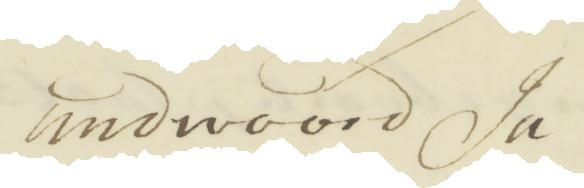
andwoord Ja
